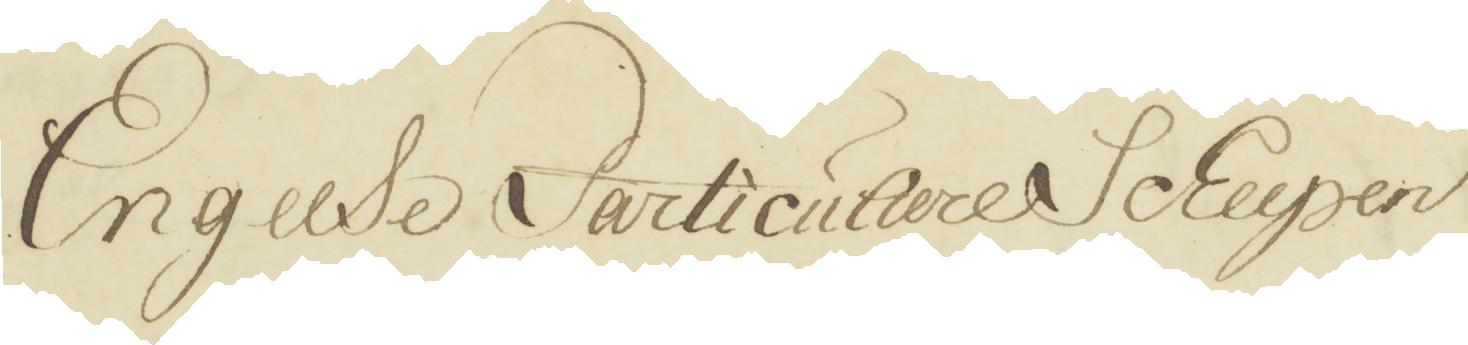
Engelse Particuliere Scheepen
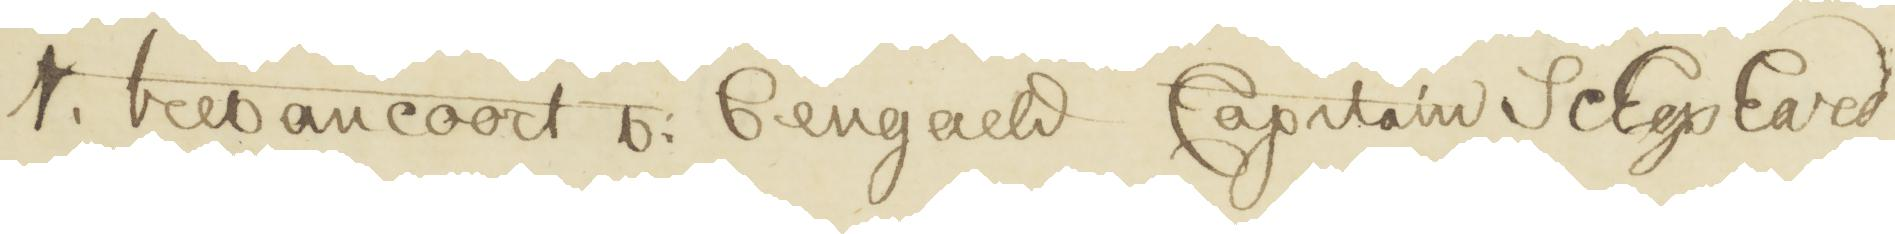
1. trevancoort v: bengaele Capitain schephard
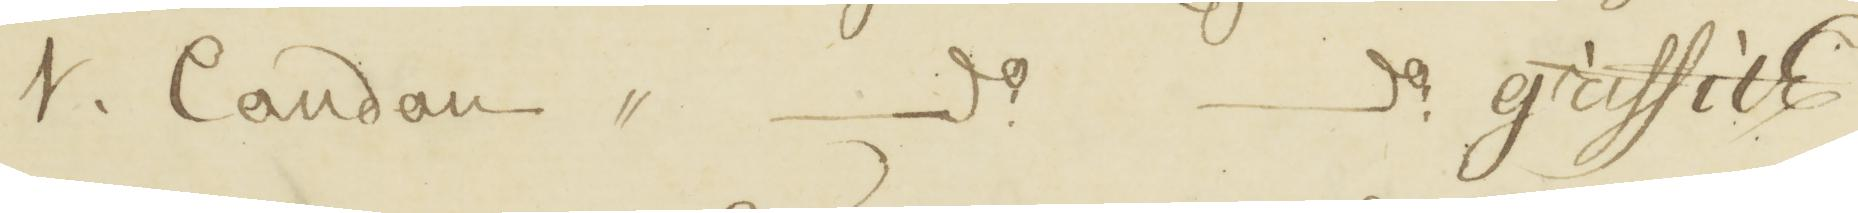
1. Candan „ _:o _:o griffith
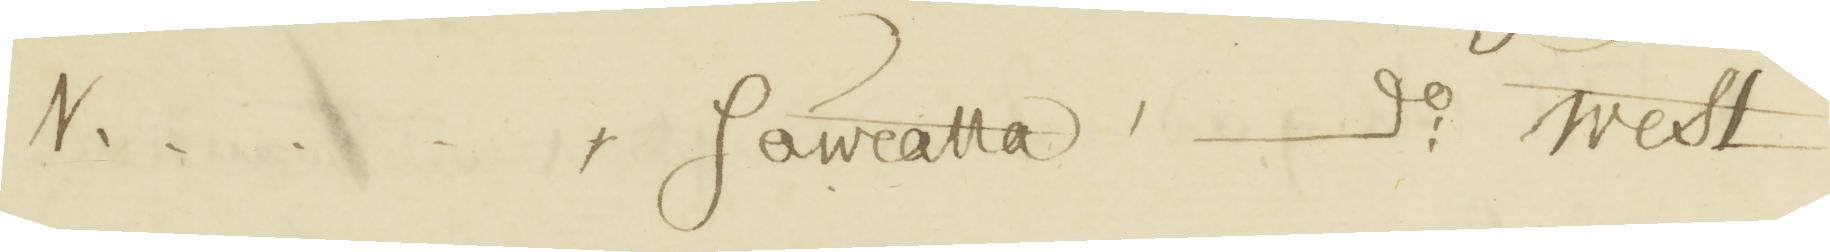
1. . . . souratta _:o west
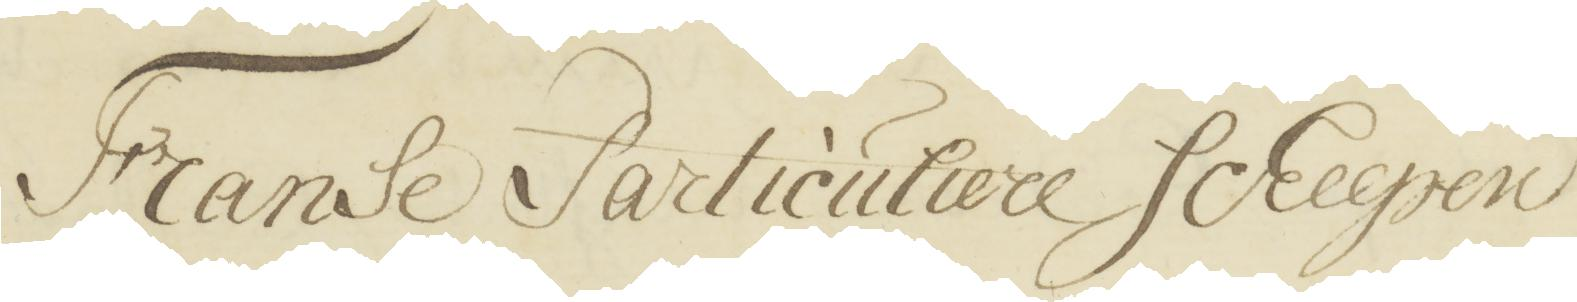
Franse Particuliere Scheepen
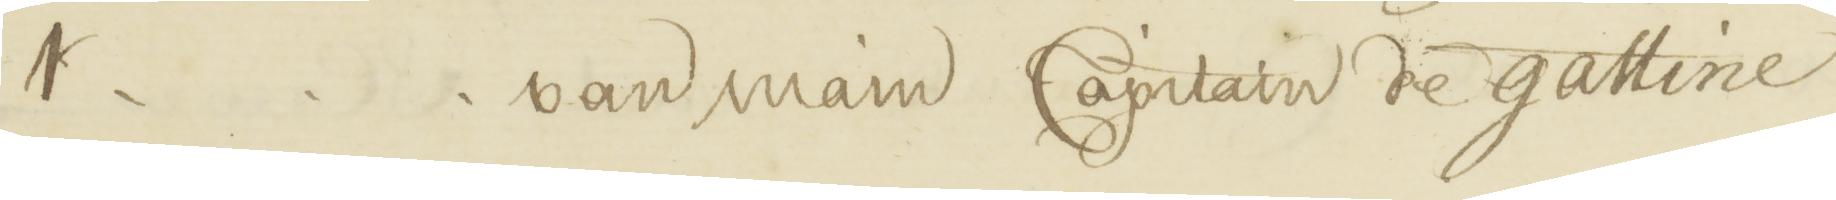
1 - - - van main Capitain de gattine
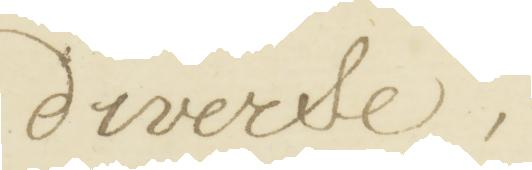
diverse,
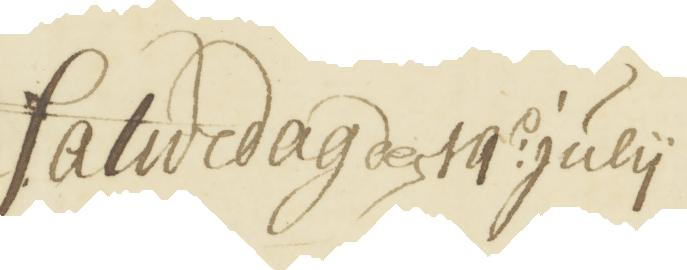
Saturdag den 14:e julij
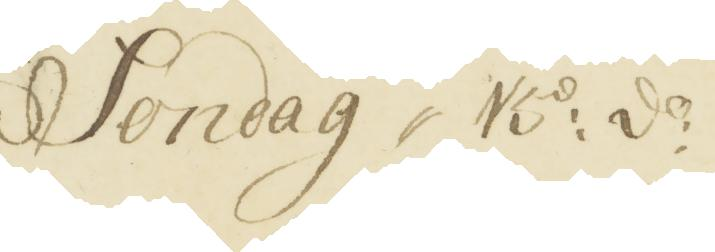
Sondag „ 15:e d:o
